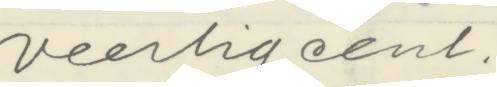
veertig cent
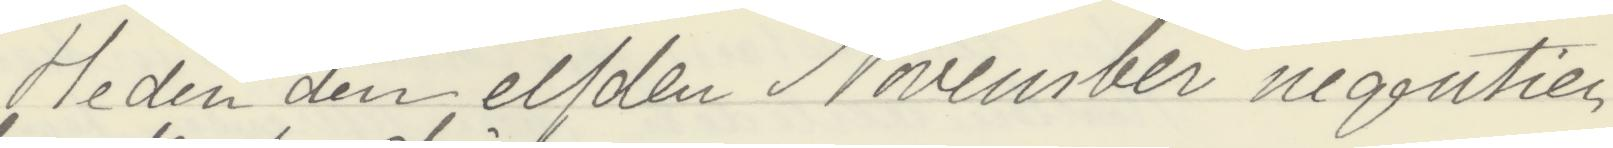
Heden den elfden November negentien
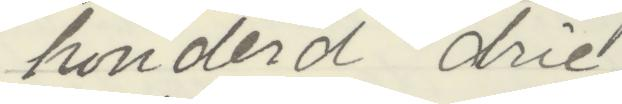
honderd drie
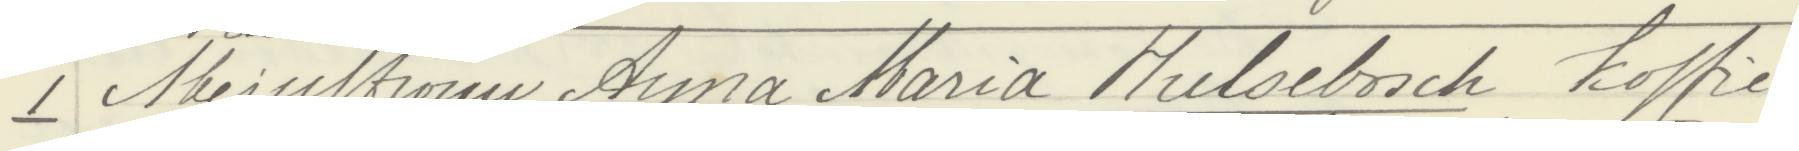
1 Mejuffrouw Anna Maria Hulsebosch, koffie
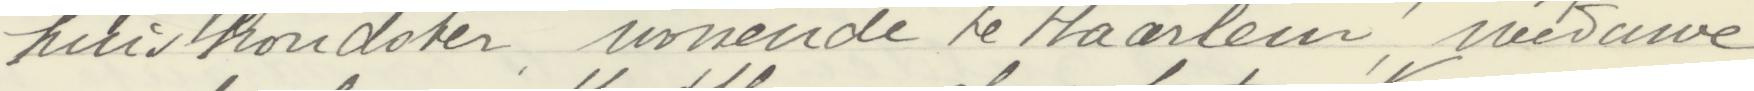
huishoudster, wonende te Haarlem, weduwe
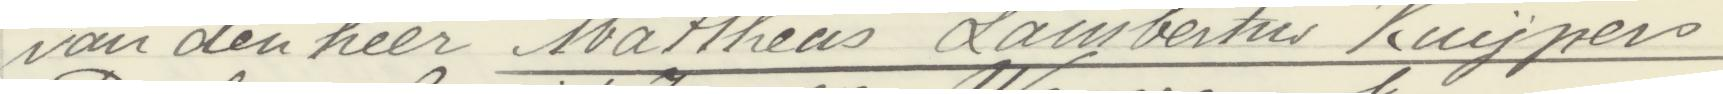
van den heer Mattheus Lambertus Kuijper
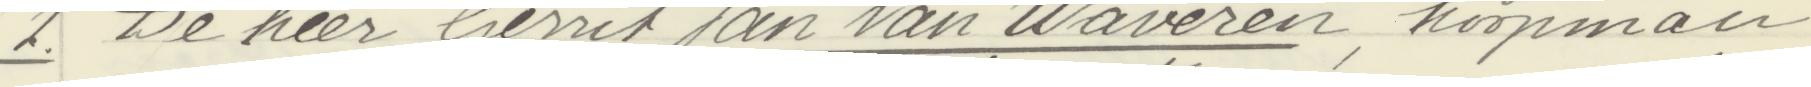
2. De heer Gerrit Jan van Waveren, koopman
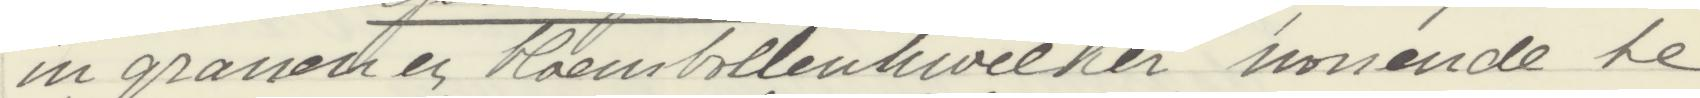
in granen en bloembollenkweeker wonende te
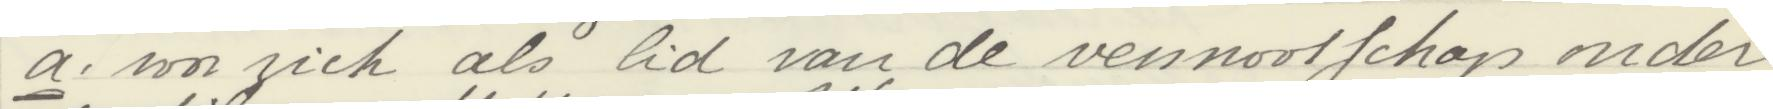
a. voor zich als lid van de vennootschap onder
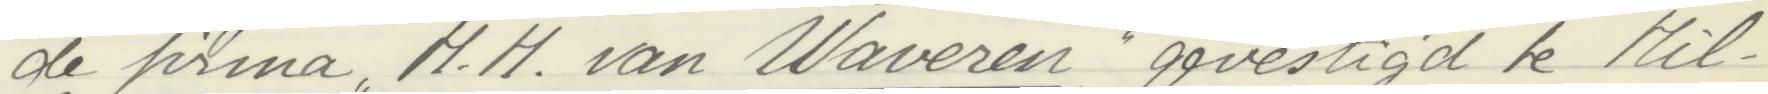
de firma „ H. H. van Waveren, " gevestigd te Hil-
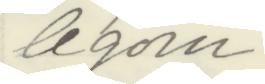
legom
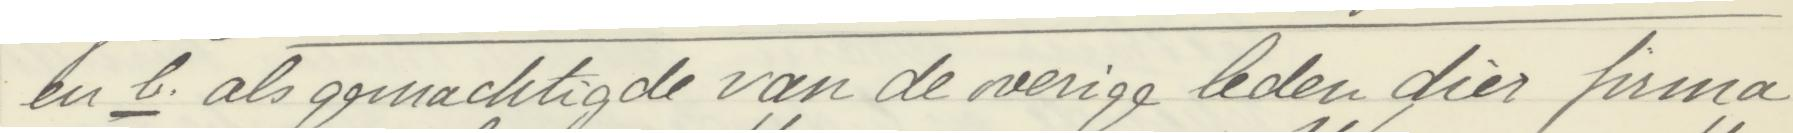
en b. als gemachtigde van de overige leden dier firma
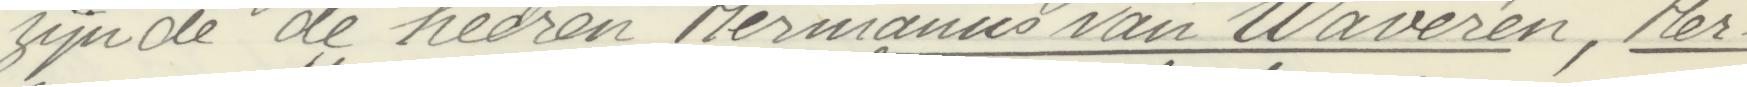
zijnde de heeren Hermanus van Waveren, Her
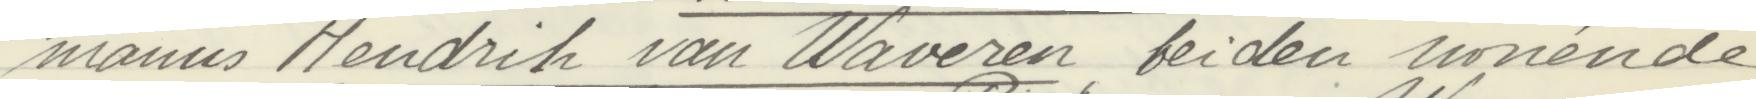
manus Hendrik van Waveren beiden wonende
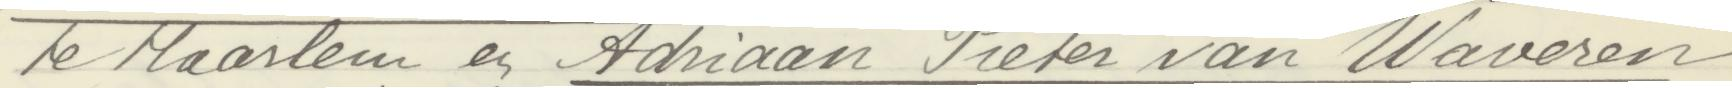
te Haarlem en Adriaan Pieter van Waveren
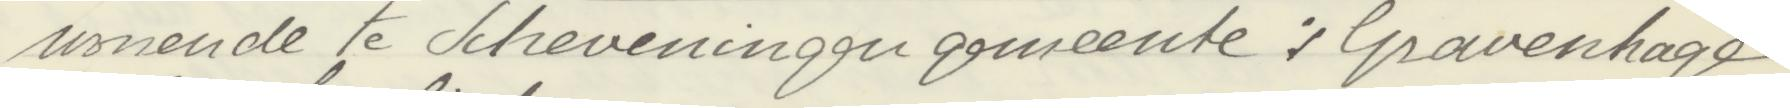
wonende te Scheveningen gemeente 's Gravenhage
